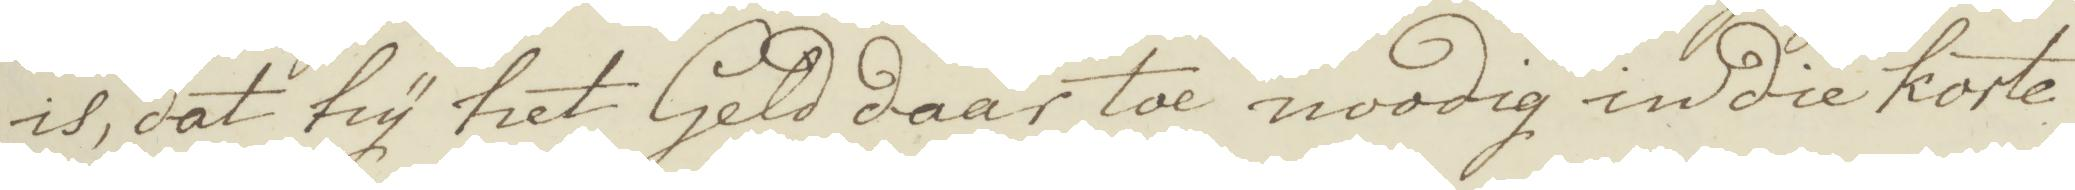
is, dat hij het Geld daar toe noodig in die korte
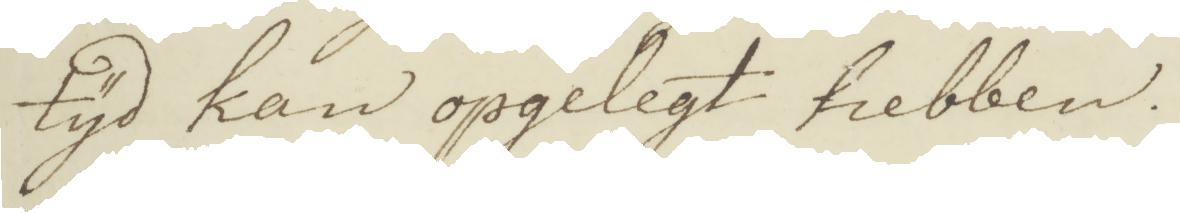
tijd kan opgelegt hebben.
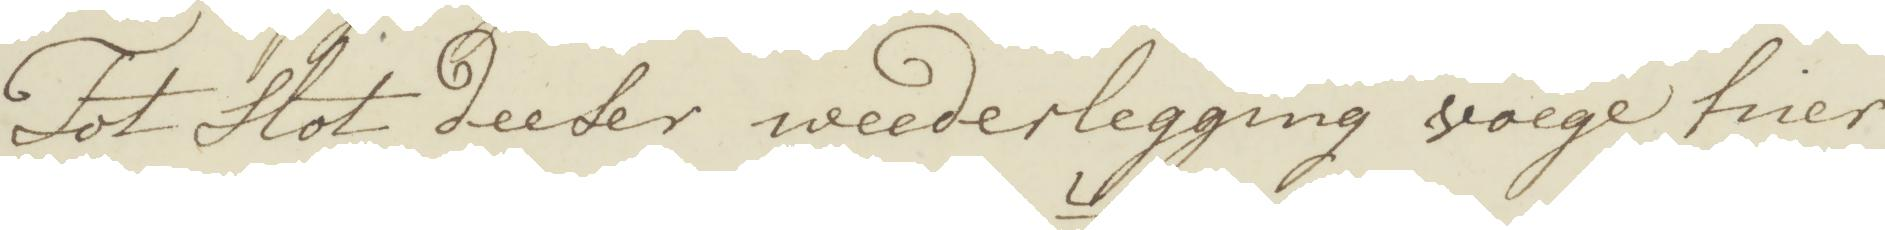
Tot slot deeser weederlegging voege hier
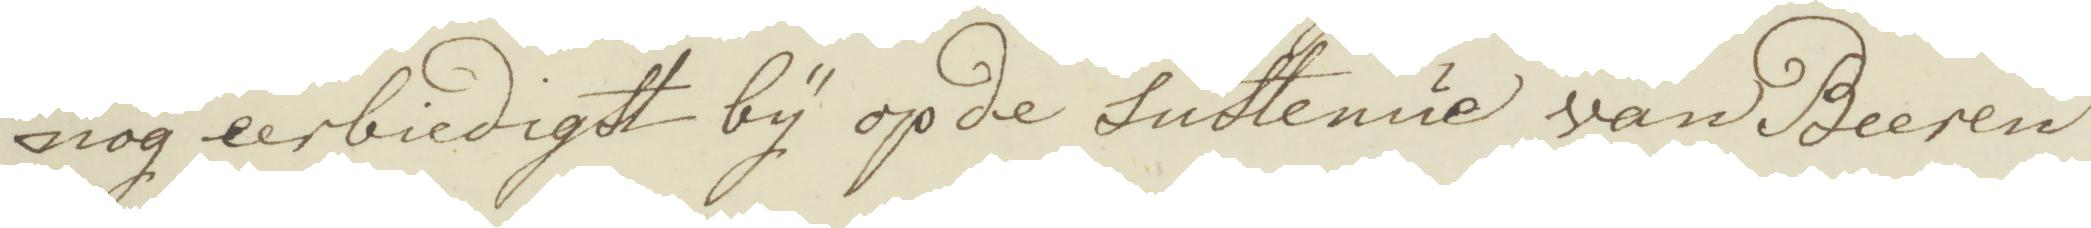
nog eerbiedigst bij op de sustenue van Beeren
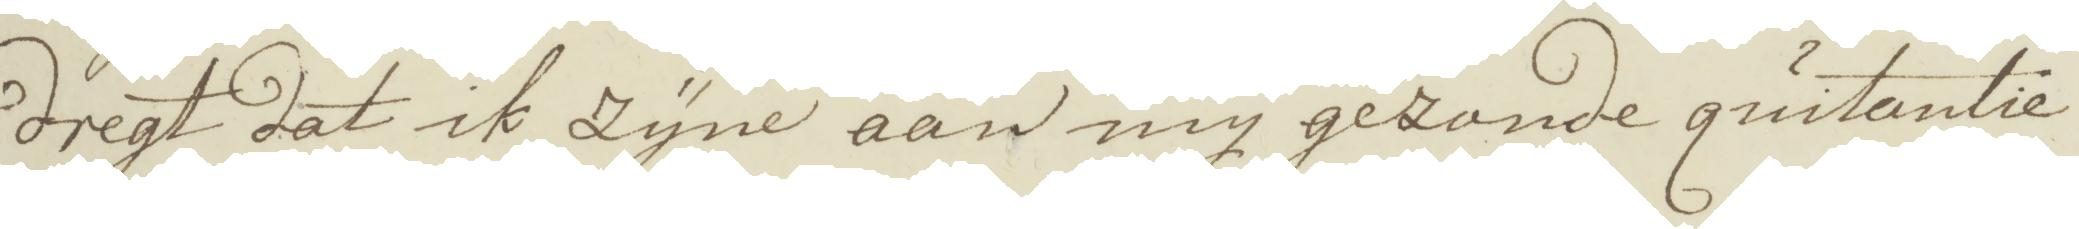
dregt dat ik zijne aan mij gezonde quitantie
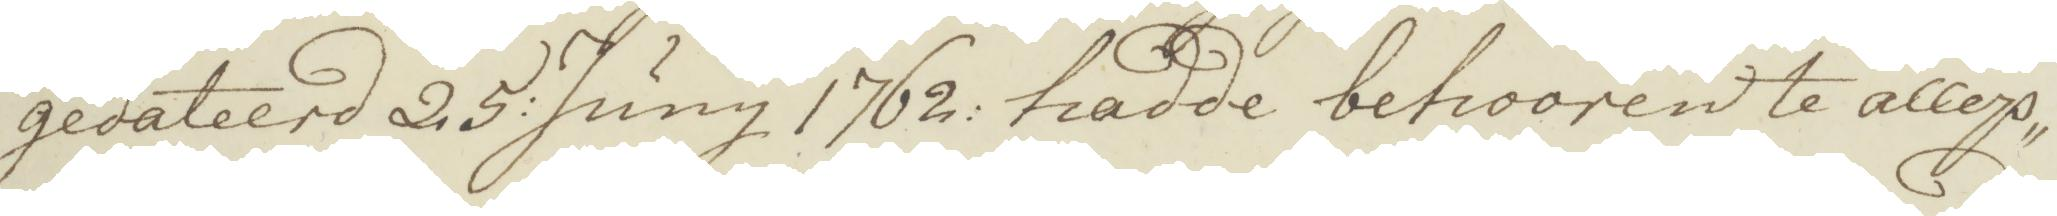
gedateerd 25: Junij 1762: hadde behooren te accep„
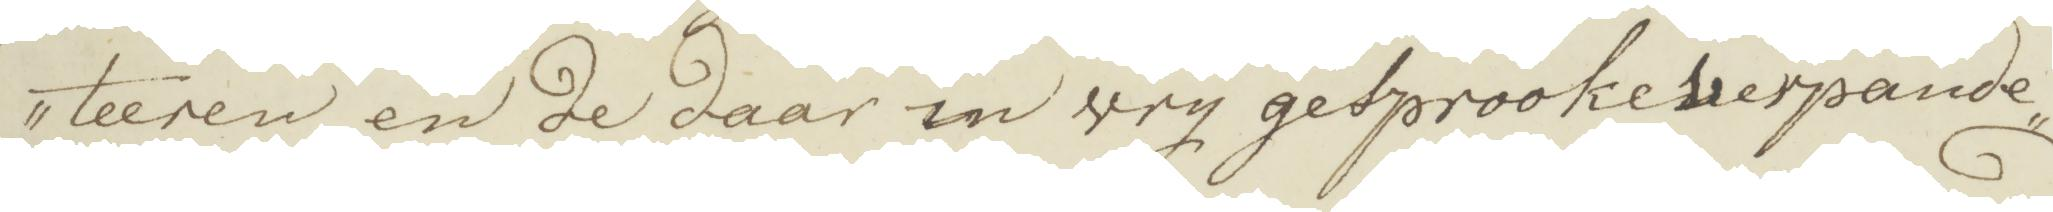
„teeren en de daar in vrij gesprooke verpande„
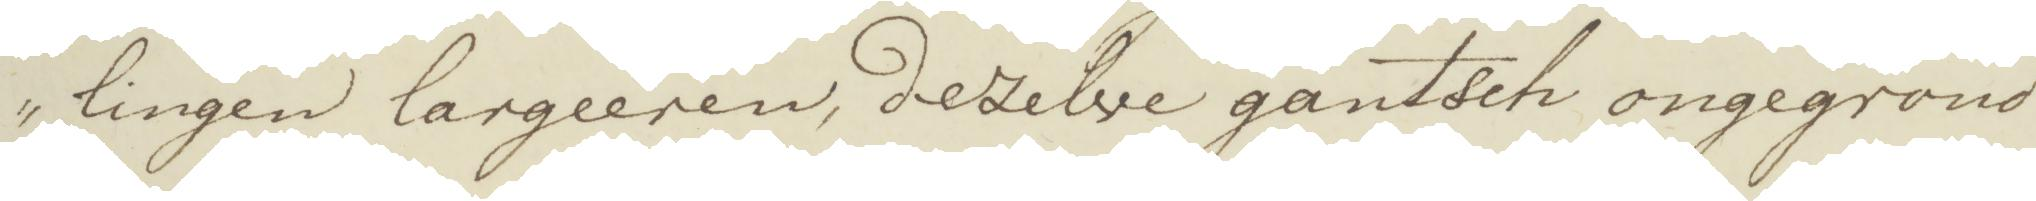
„ lingen largeeren, dezelve gantsch ongegrond
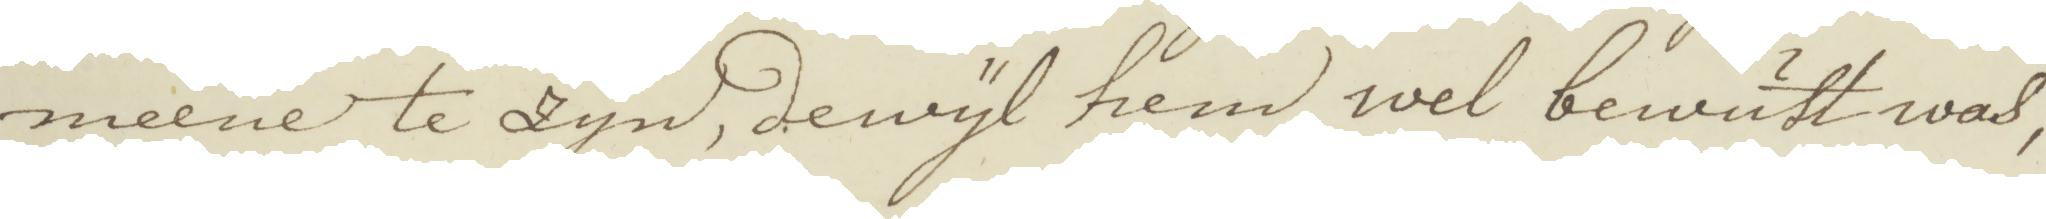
meene te zijn, dewijl hem wel bewust was,
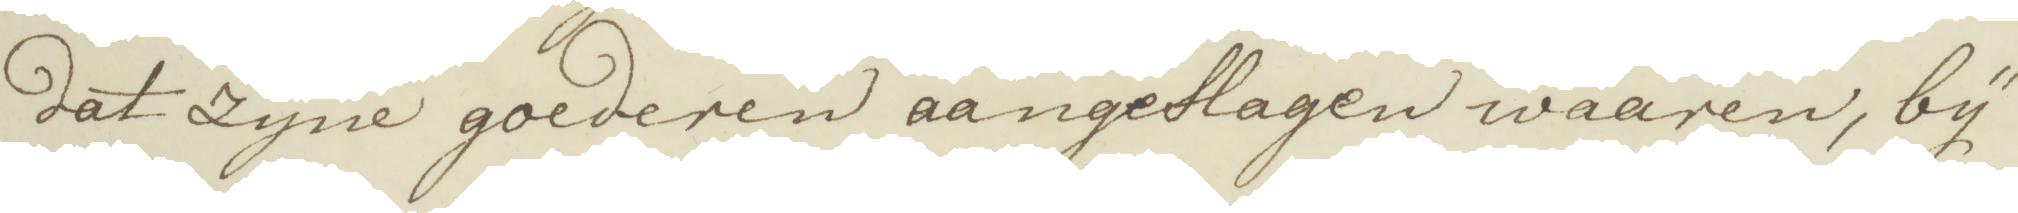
dat zijne goederen aangeslagen waaren, bij
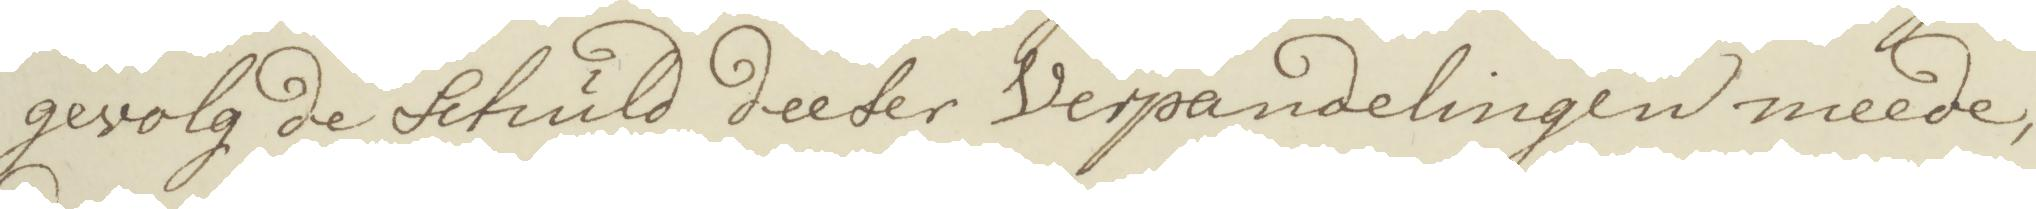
gevolg de schuld deeser Verpandelingen meede,
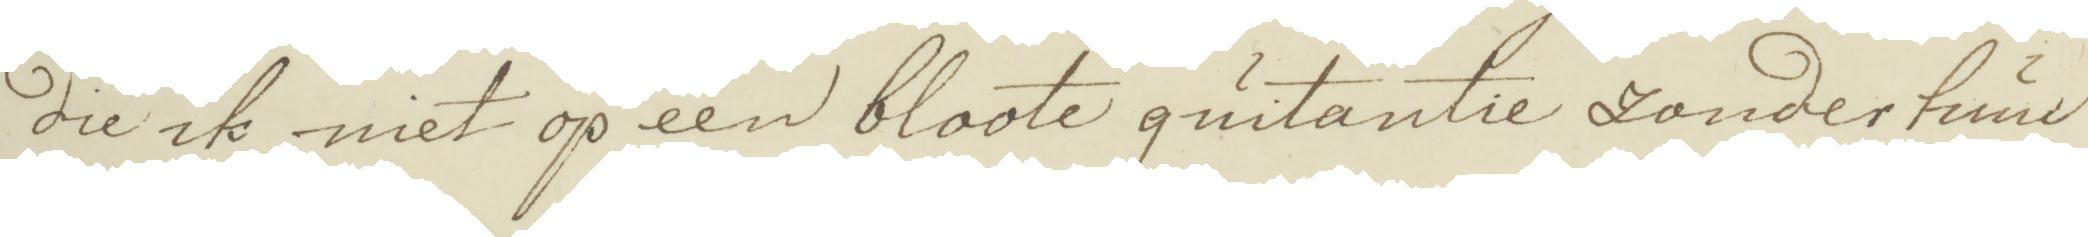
die ik niet op een bloote quitantie zonder hun
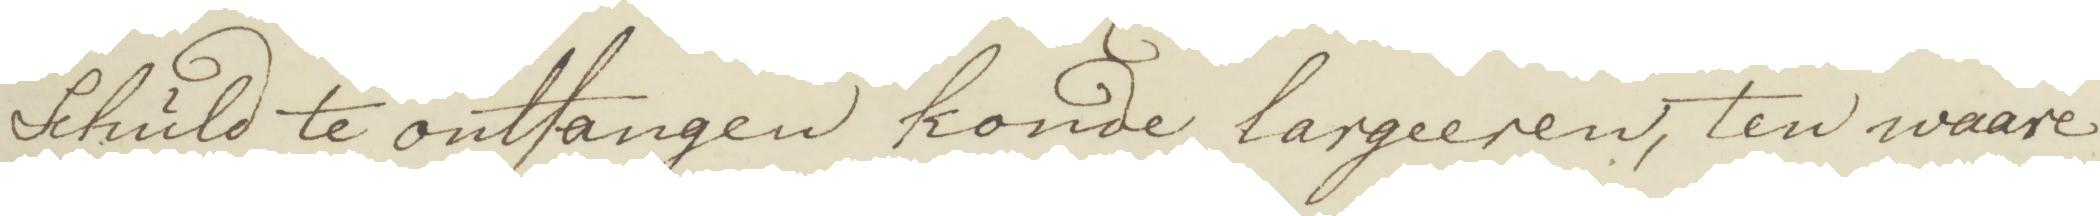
schuld te ontfangen konde largeeren, ten waare
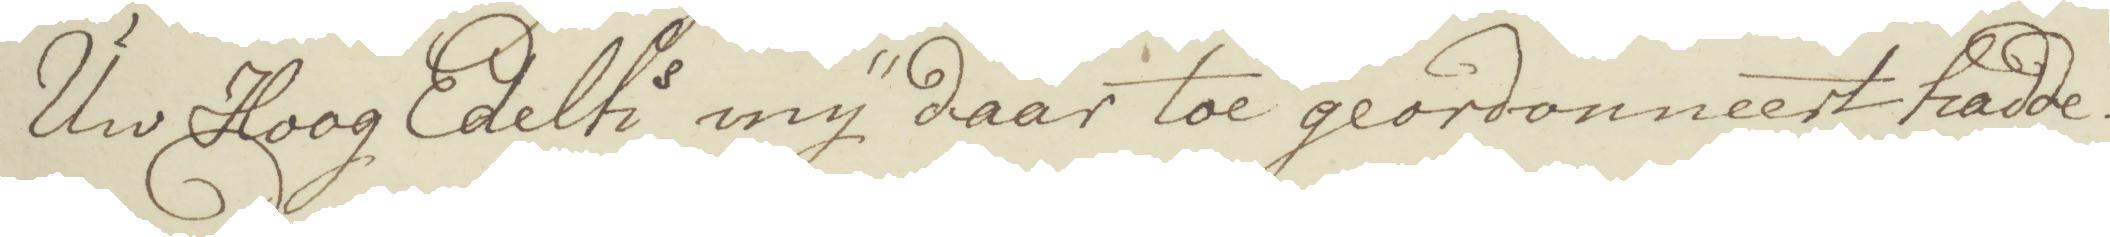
Uw Hoog Edelhs mij daar toe geordonneert hadde.
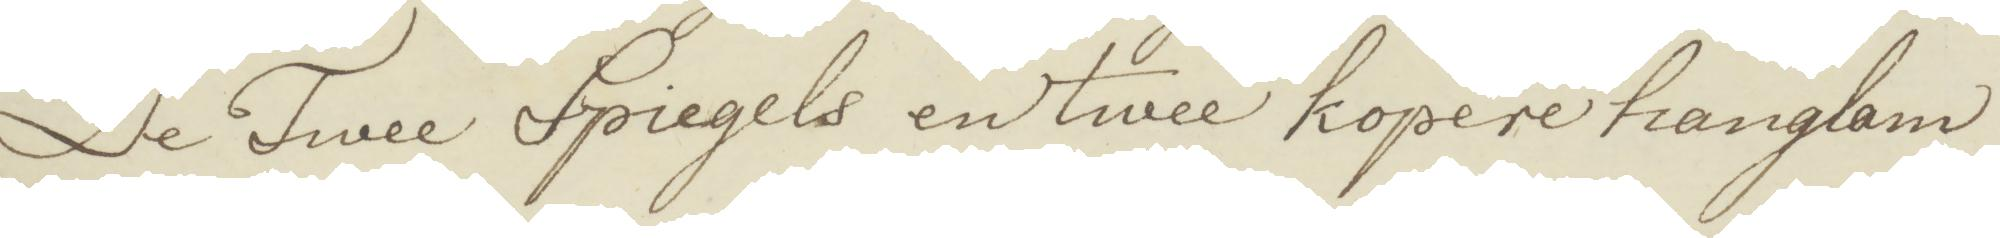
De Twee spiegels en twee kopere hanglam
